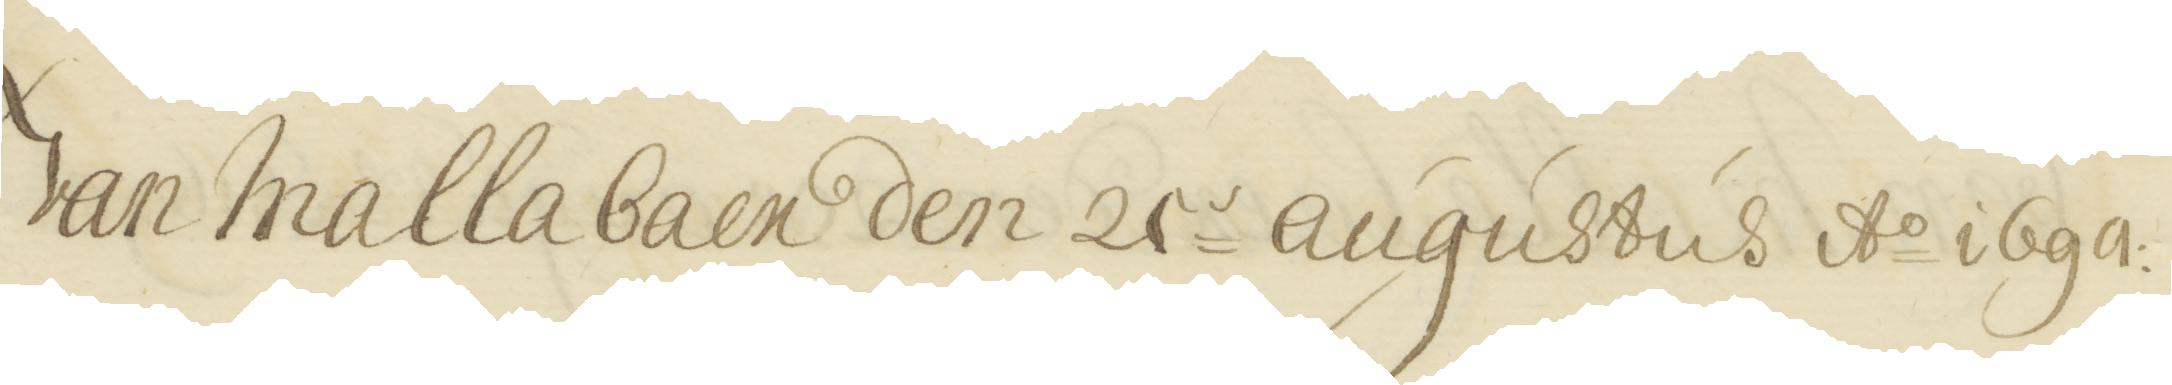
Van mallabaer den 25=' augustus A=o 1694:
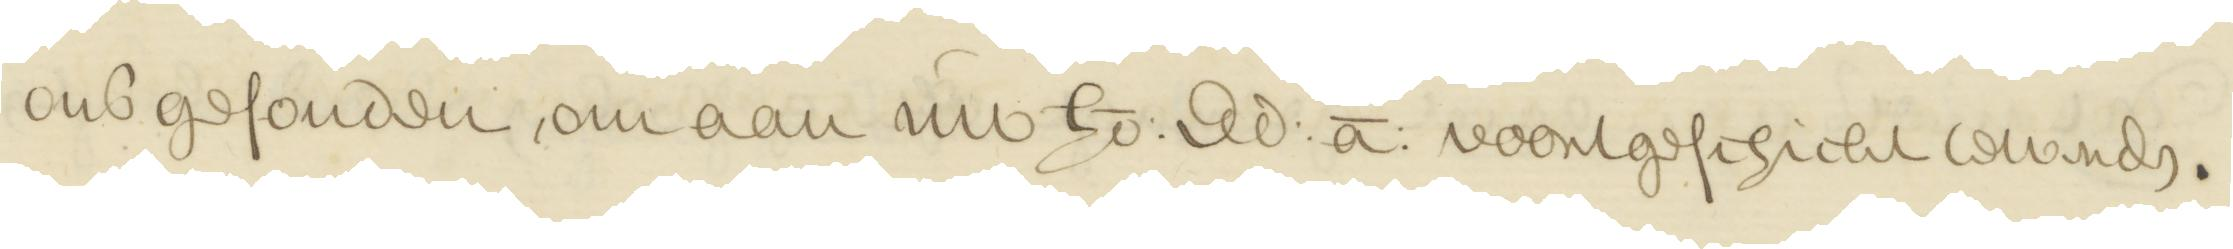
ons gesonden, om aan uw ho: Ed: a: voort geschickt te werden.
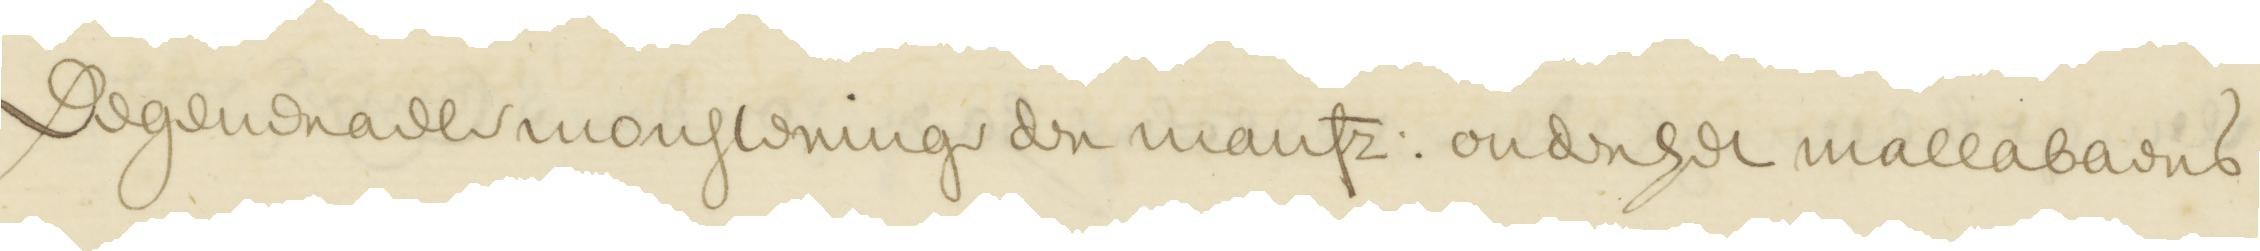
De generaele monsteringe der mansz: onder het mallabaers
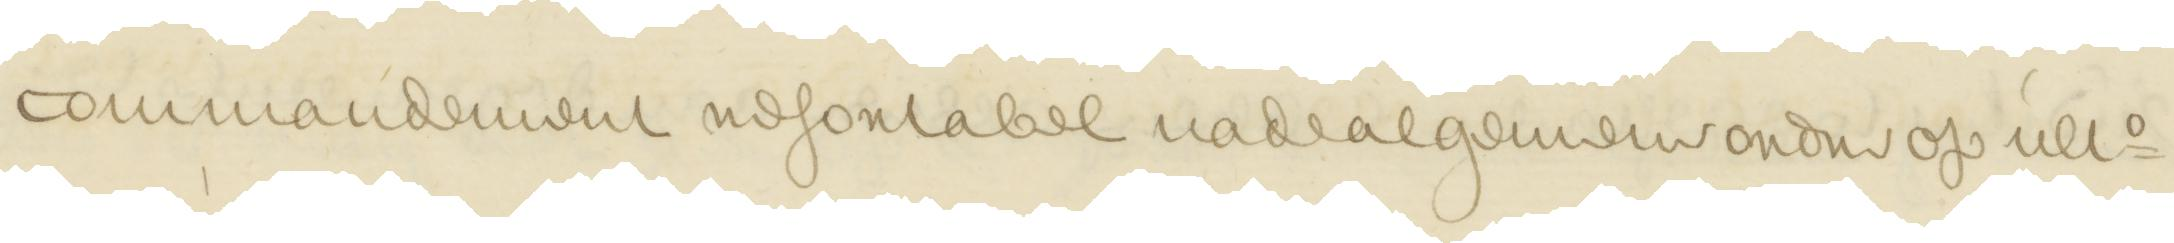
commandement resortabel na de algemene ordre op ult=o
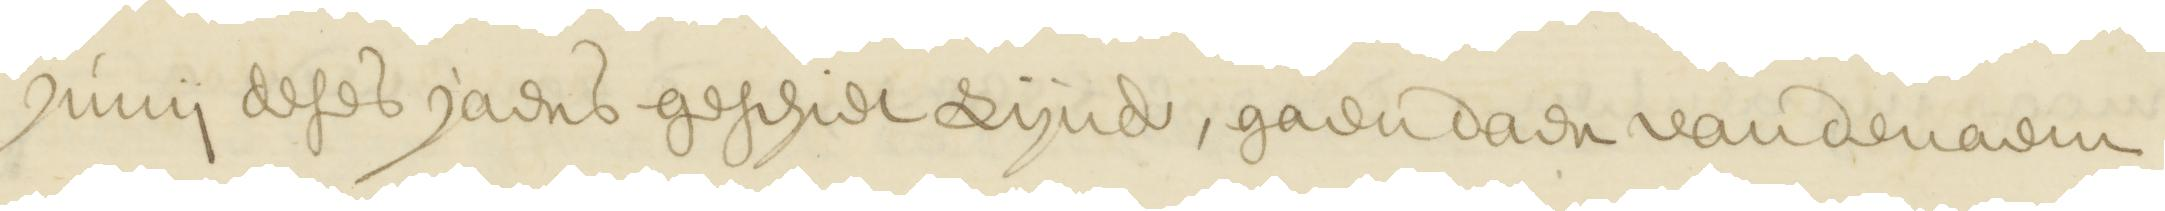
junij deses jaers geschiet zijnde, gaen daer van de naem
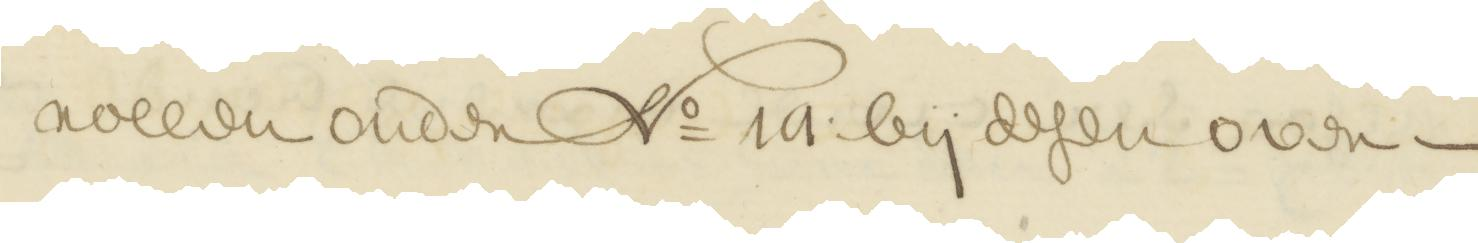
rollen onder N=o 14. bij desen over —
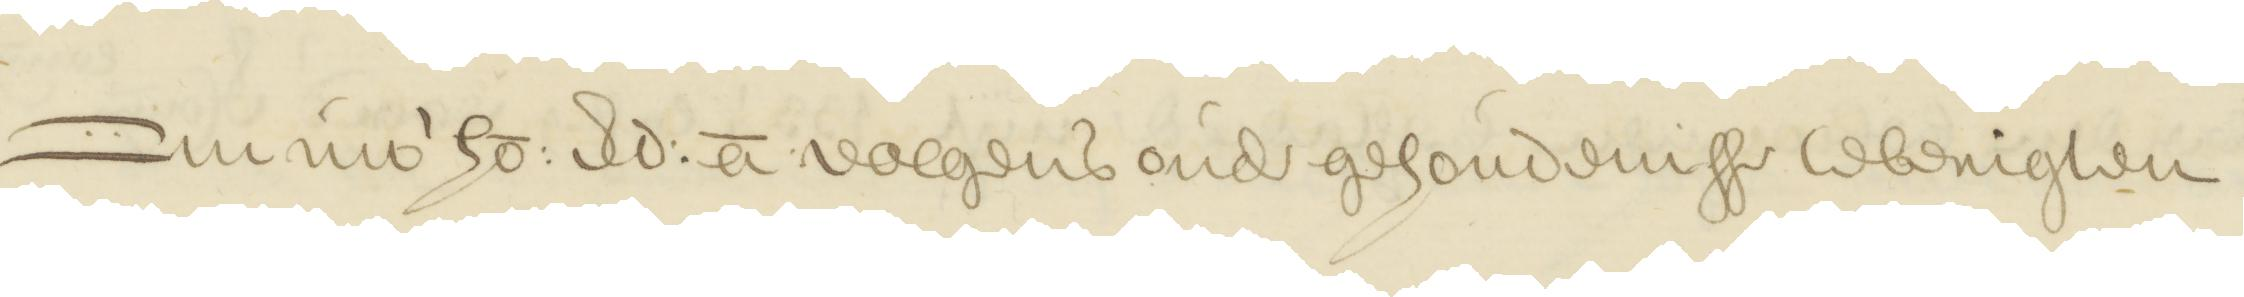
Om uw' ho: Ed: a: volgens oude gehoudenisse te berigten
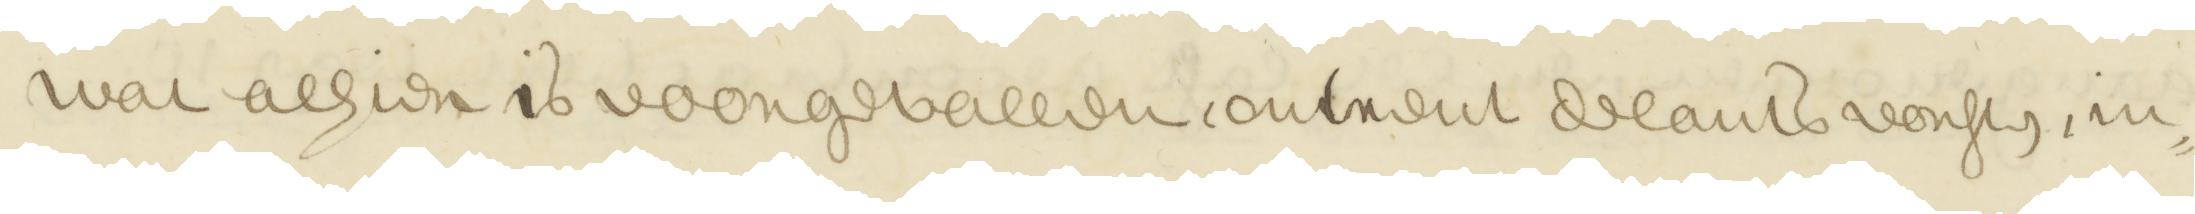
wat alhier is voorgevallen, ontrent delants vorsten, in„
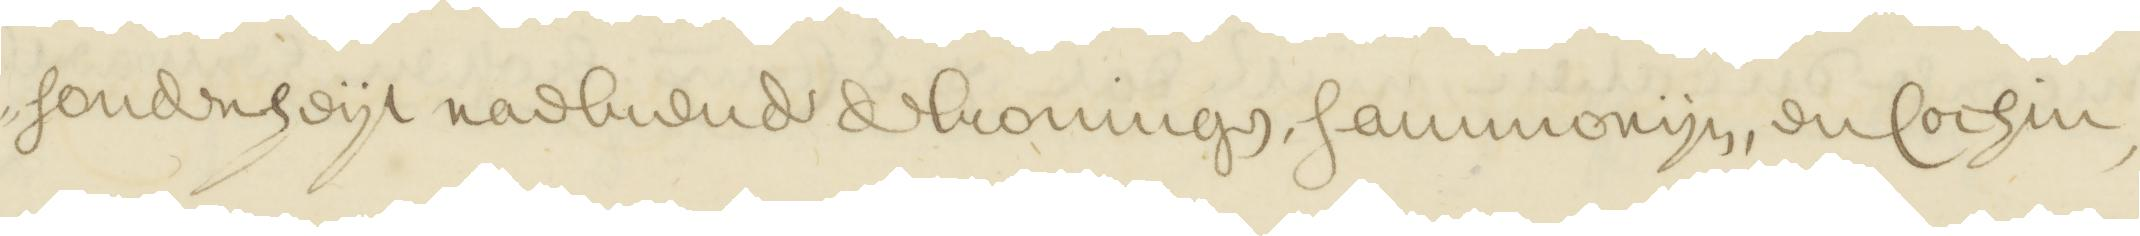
„sonderheijt raekende de koningen, sammorijn, en cochin„
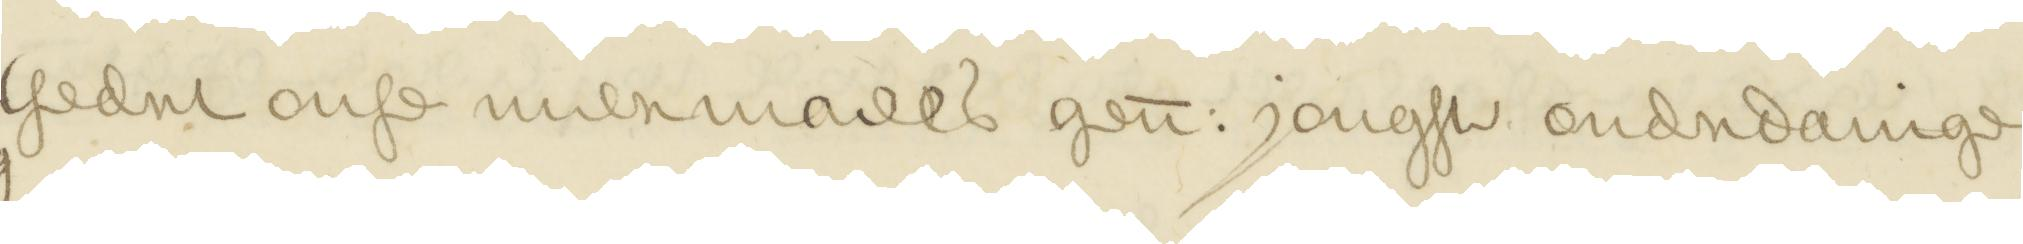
sedert onse mermaels gen: jongste onderdanige
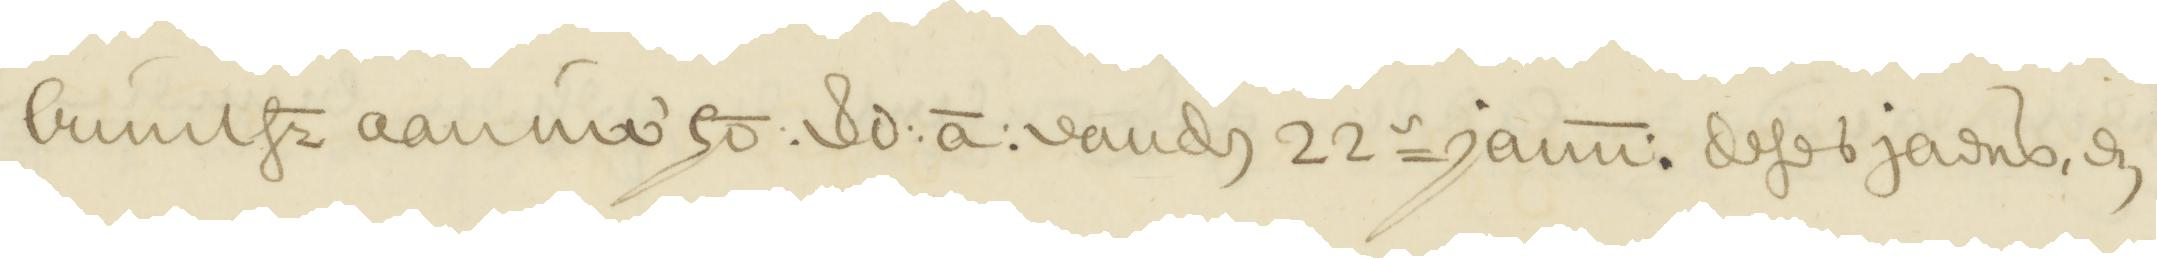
kuntsz aan uw' ho: Ed: a: van den 22=n janu: deses jaers, en
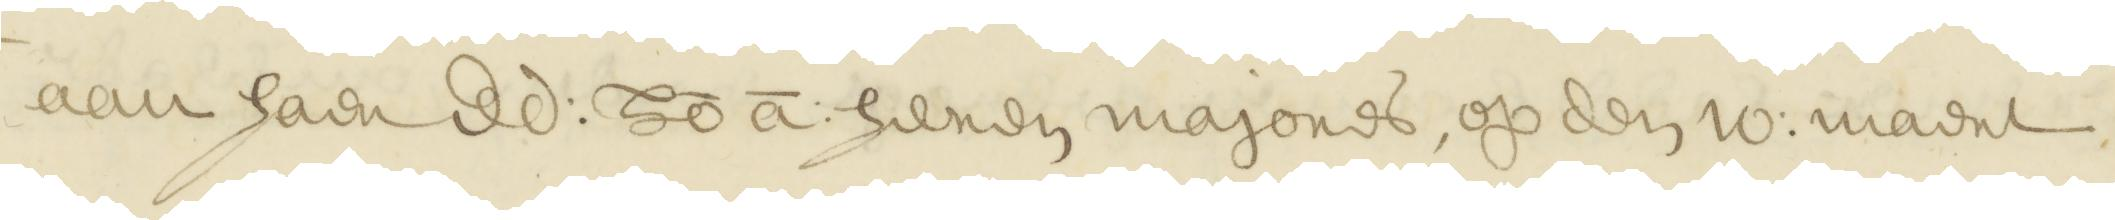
aan haer Ed: ho a: heren majores, op den 10: maert
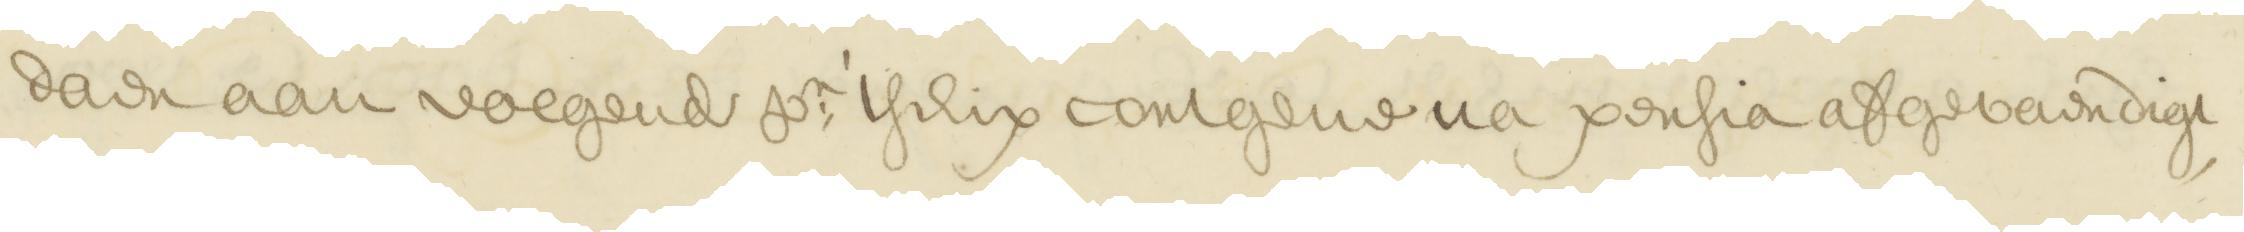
daer aan volgende p:r 'tschip cortgene na persia afgevaerdigt,
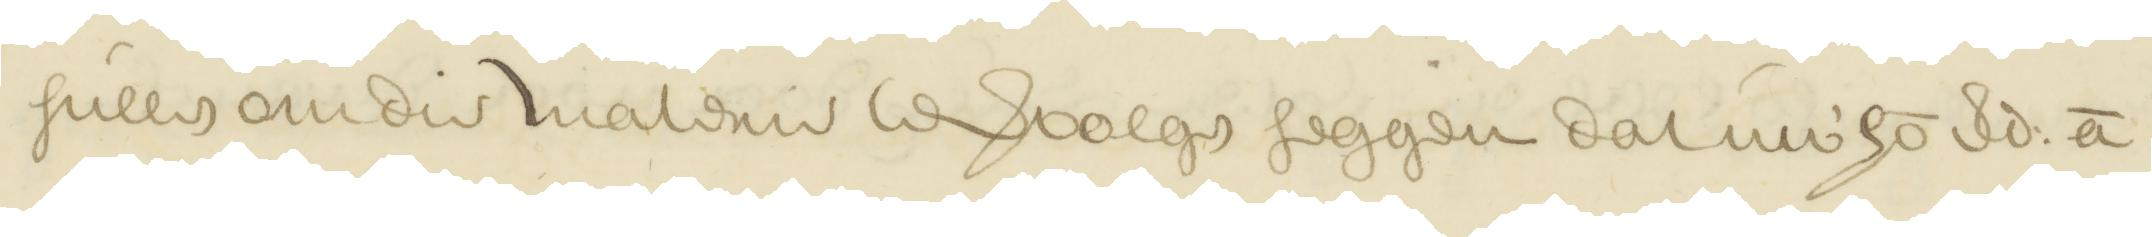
sullen om die materie te vervolgen seggen dat uw' ho Ed: a
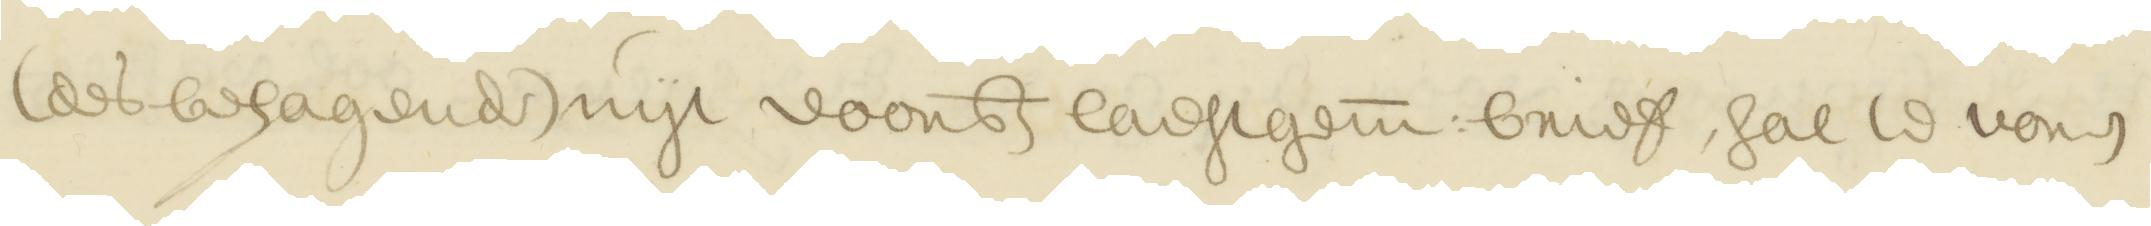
(des behagende) uijt voorsz laestgem: brief, sal te voren
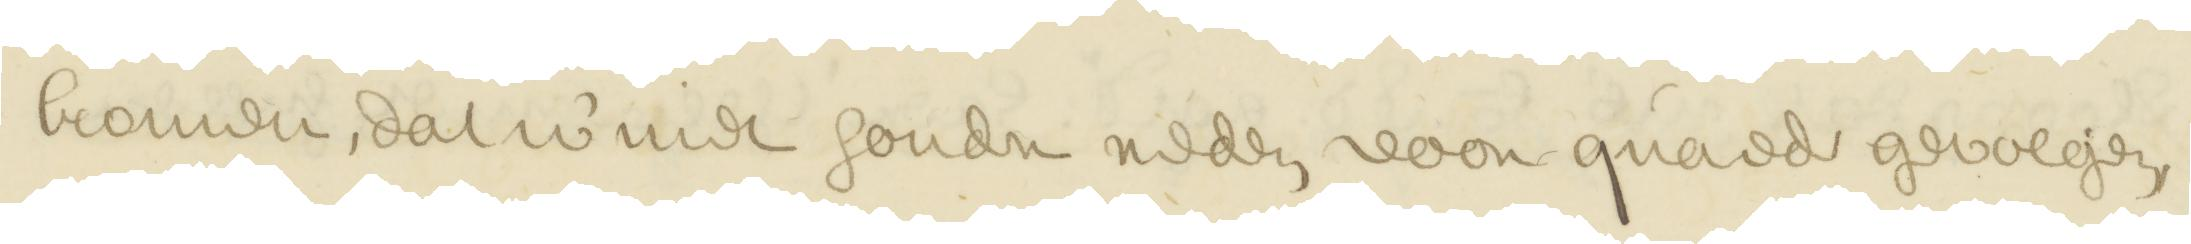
komen, dat w' niet sonder reden voor quaede gevolgen
